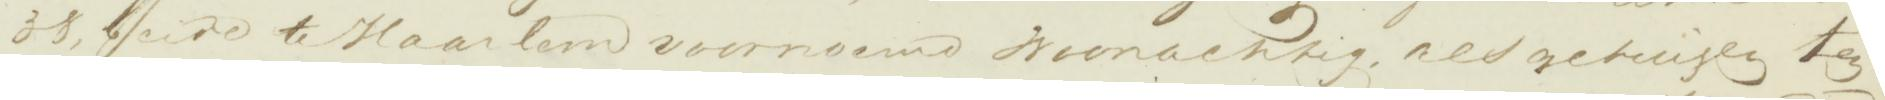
38, beide te Haarlem voornoemd woonachtig, als getuigen ten
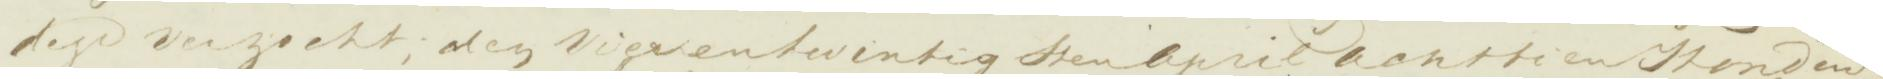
deze verzocht den Vier entwintigsten April achttien Honderd
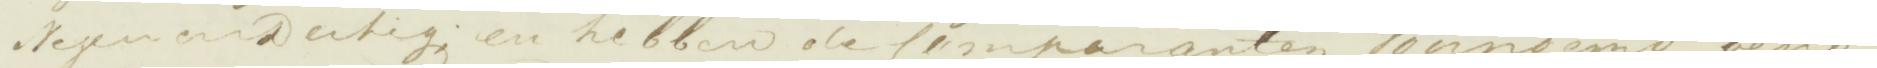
Negen endertig; en hebben de Comparanten voornoemd, bene
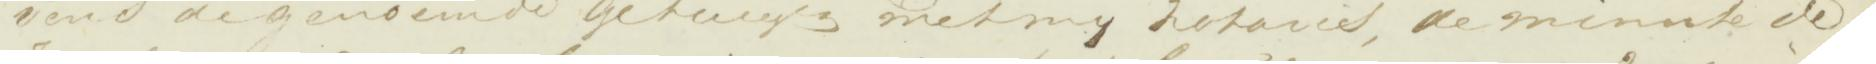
vens de genoemde getuigen met my notaris, de minute de
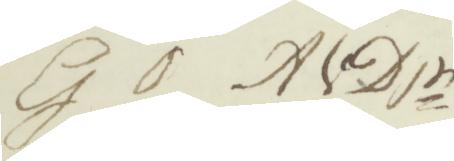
G O A V D j=r
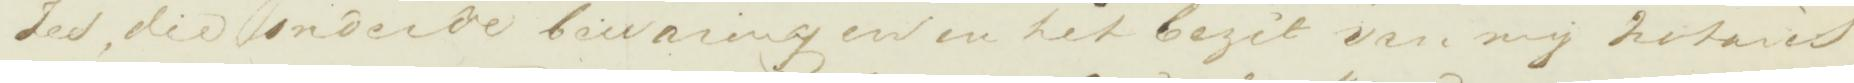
zes, die onderde bewaring en in het bezit van mij notaris
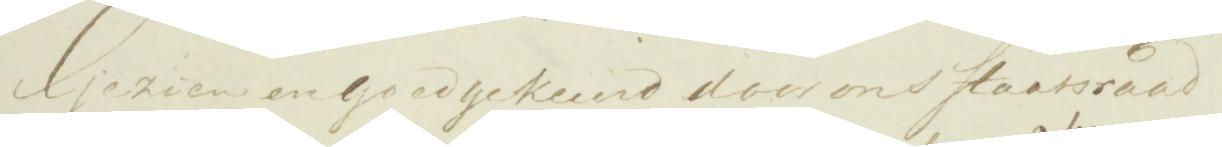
Gezien en goedgekeurd door ons Staatsraad
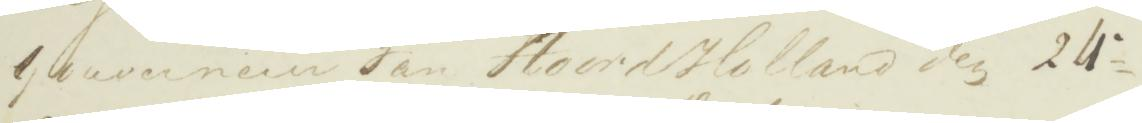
Gouverneur van Noord Holland den 24=e
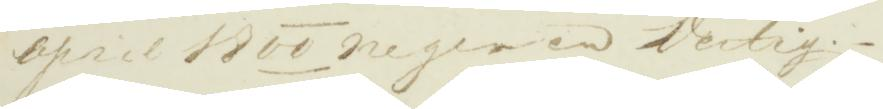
April 1800negen en Dertig.-
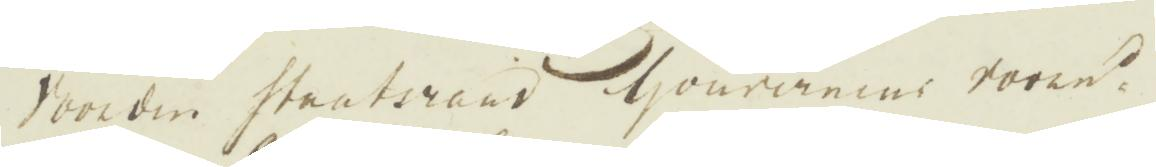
Voor den staatsraad Gouverneur voorn.d
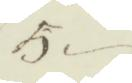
5—
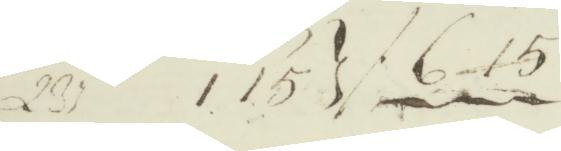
23% 1 15 } ƒ 6 15
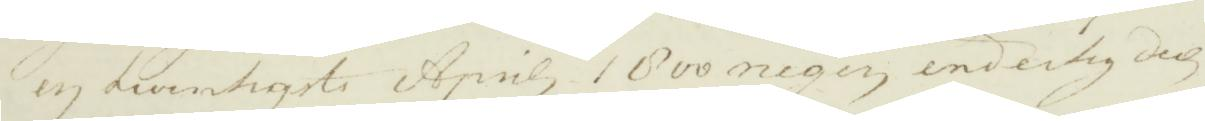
en twintigste April 1800 negen endertig deel
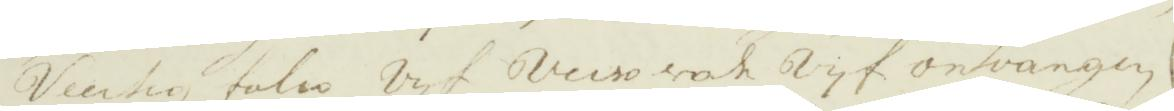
Veertig folio vyf Verso vak vijf onvangen
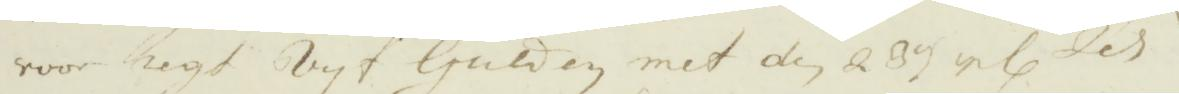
voor regt Vyf Gulden met de 23% op C Zes
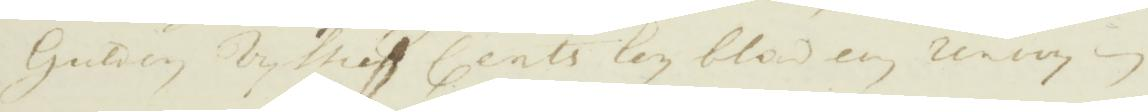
Gulden Vyftig Cents Een blad een renvoy
